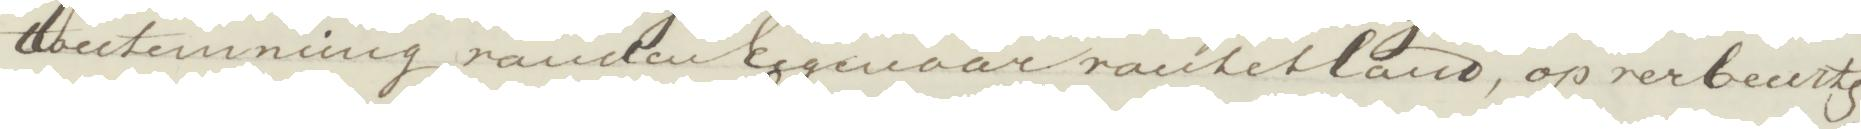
toestemming van den Eigenaar van het land, op verbeurt
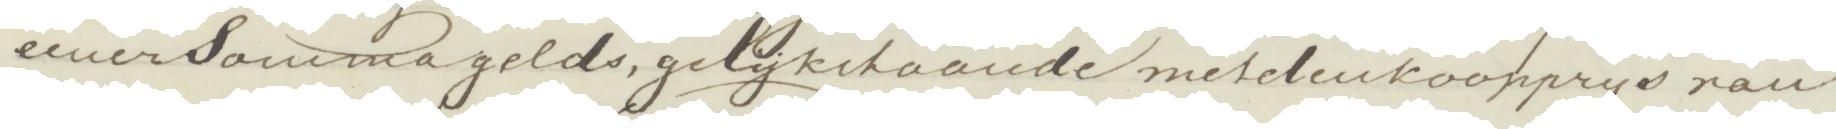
eener somma gelds, gelijkstaande met den koopprys van
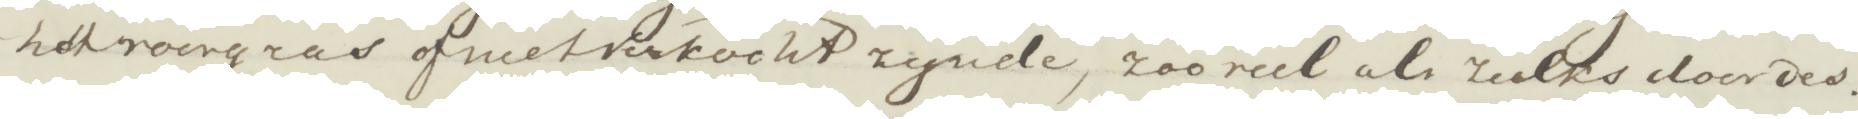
het voorgras of niet verkocht zynde, zoo veel als zulks door des
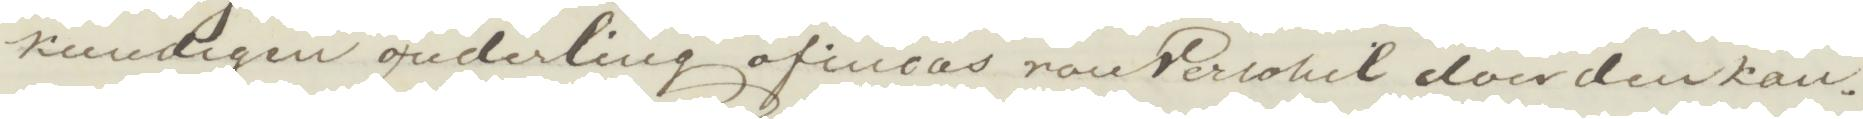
kundigen onderling of incas van Verschil door den kan„
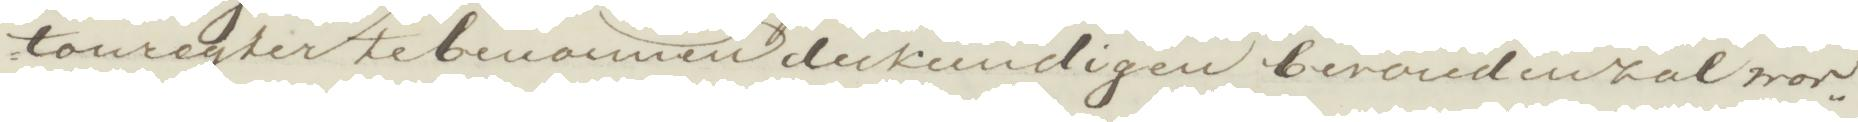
=tonregter te benoemen deskundigen bevonden zal wor„
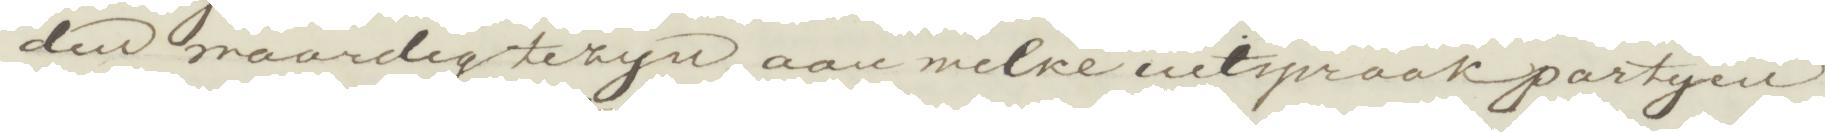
den waardig te zyn aan welke uitspraak partyen
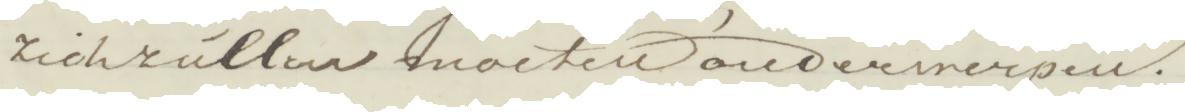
zich zullen moeten onderwerpen.
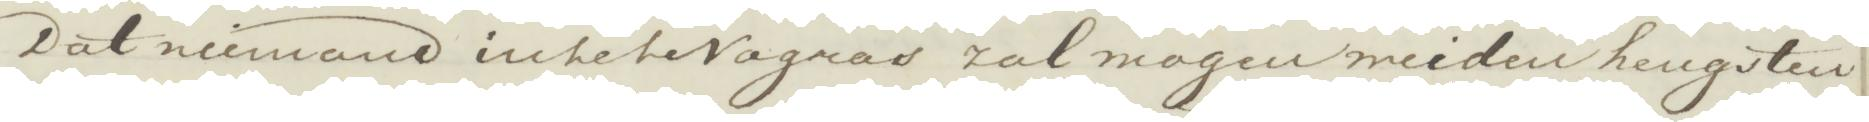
Dat niemand in het Nagras zal mogen weiden hengsten
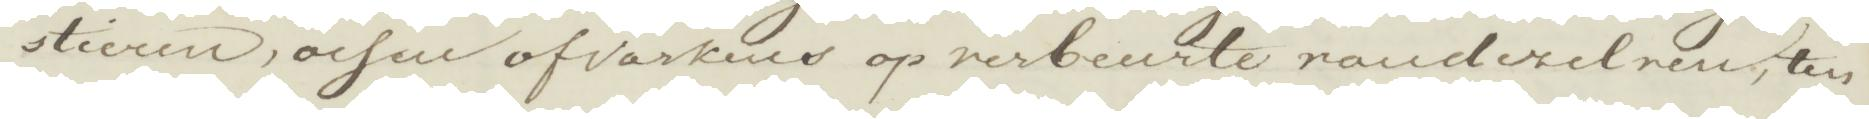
stieren, ossen of varkens op verbeurte vandezelven, ten
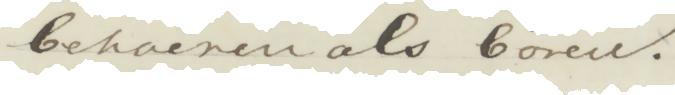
behoeven als boven.
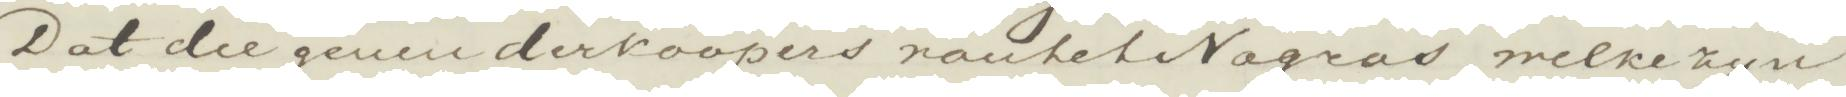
Dat die genen der koopers van het Nagras welke zyn
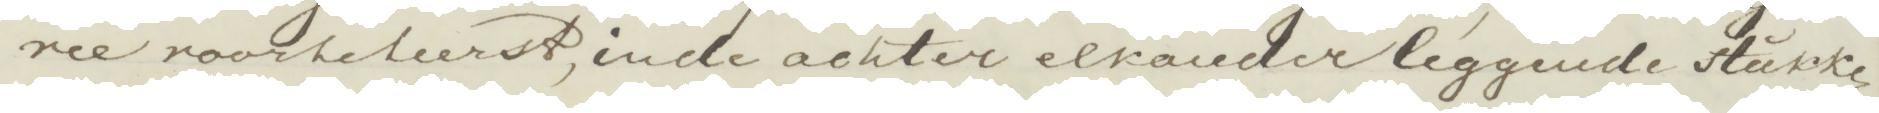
vee voor het eerst, in de achter elkander leggende stukken
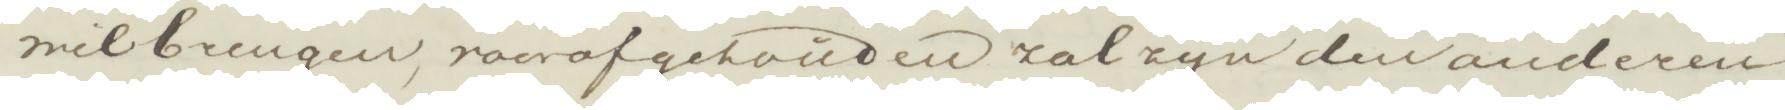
wil brengen, voor of gehouden zal zyn den anderen
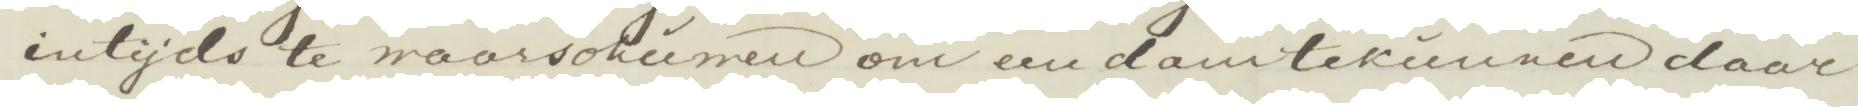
intijds te waarschuwen om een dam te kunnen daar
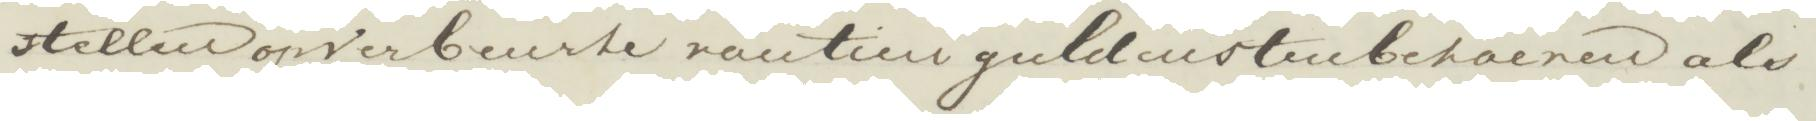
stellen op verbeurte vantien guldens ten behoeven als
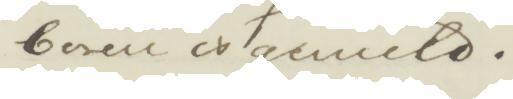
boven is gemeld.
